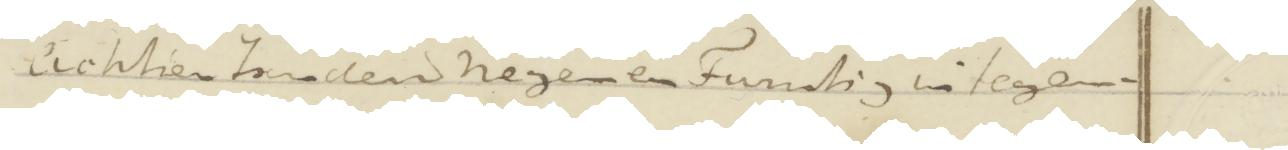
Achtien honderd negen en Twintig integen-
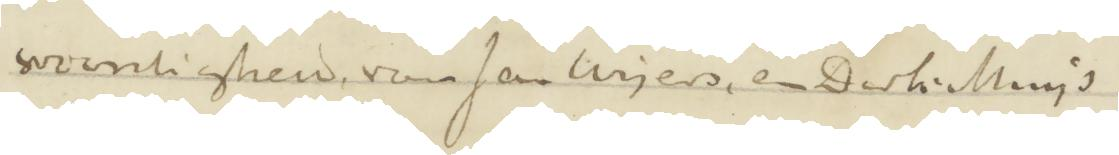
woordigheid van Jan wijers, en Dirk Muijs
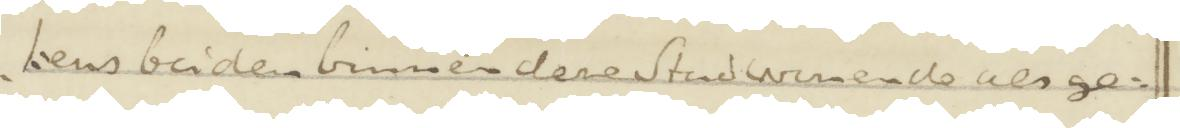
kens beiden binnen deze stad wonende als ge=
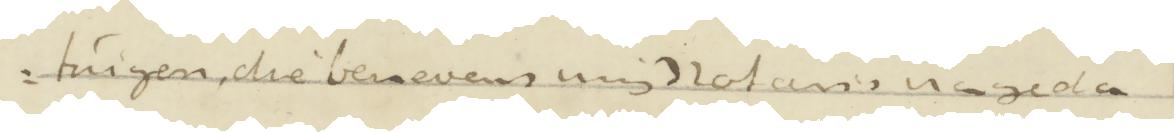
=tuigen die benevens mij Notaris na geda
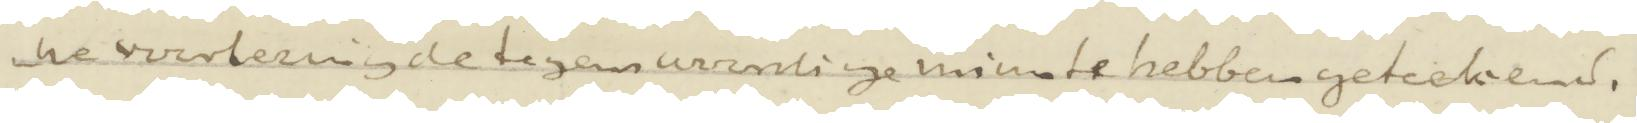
ne voorlezing de tegenswoordige minute hebben geteekend.
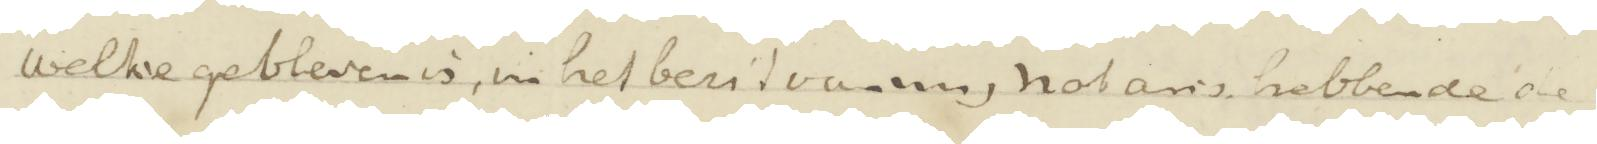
welke gebleven is, in het bezit van mij notaris, hebbende de
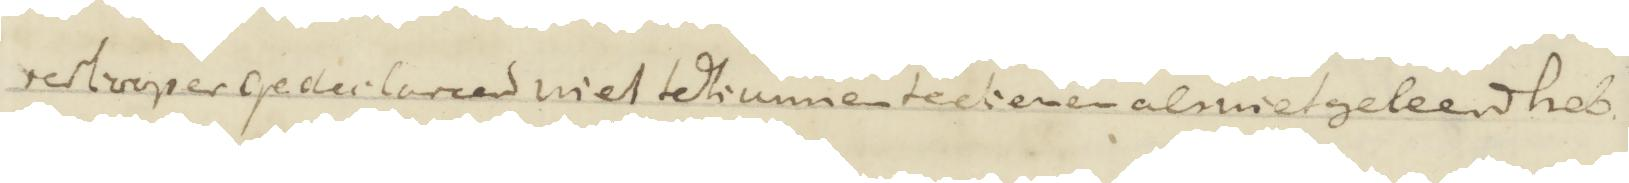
verkooper gedeclareerd niet te kunnen teekenen als niet geleerd heb
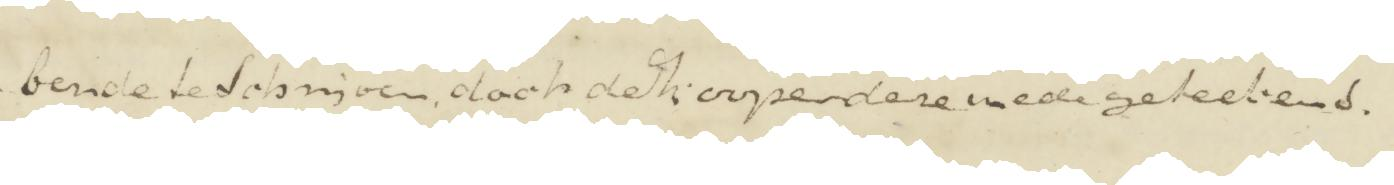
bende te schrijven, doch de kooper deze mede geteekend.
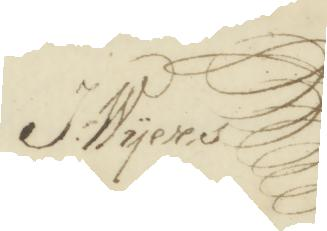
J: Wijers
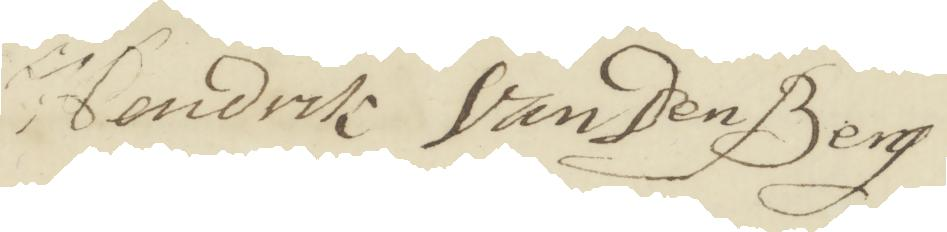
Hendrik Van Den Berg
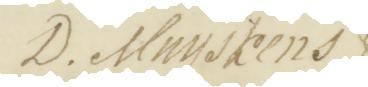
D: Muyskens.
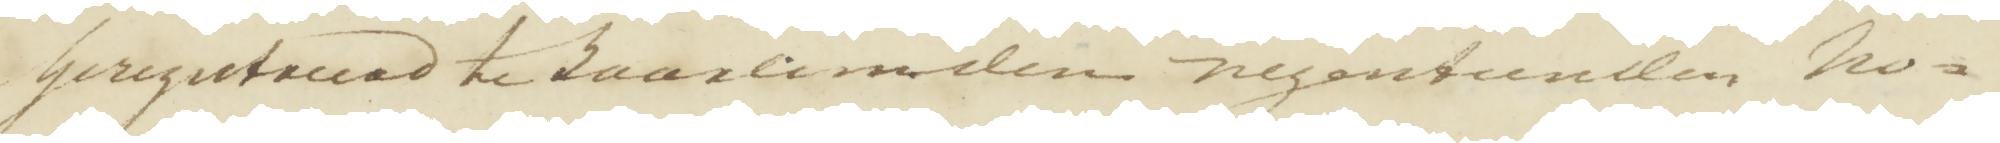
Geregistreerd te Haarlem den negentienden no=
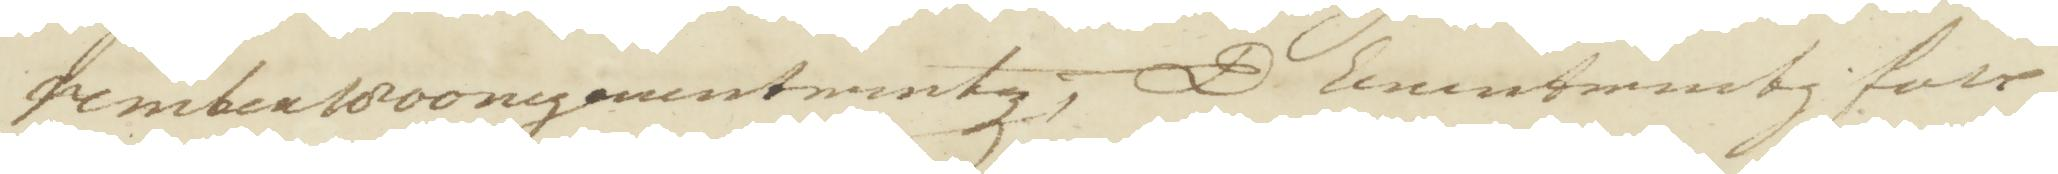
vember 1800 negenentwintig, D Eenentwintig foli
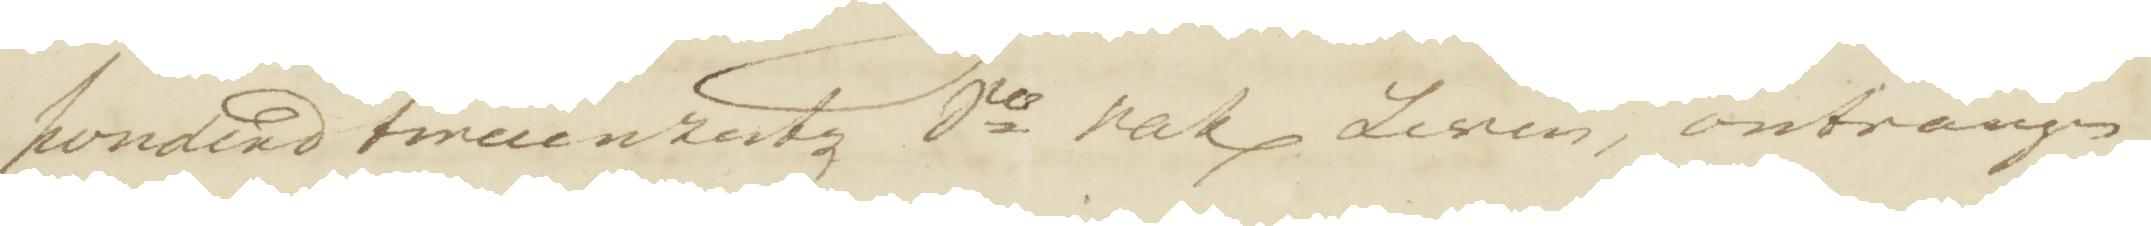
honderd tweeenzestig V=o vak zeven, ontvangen
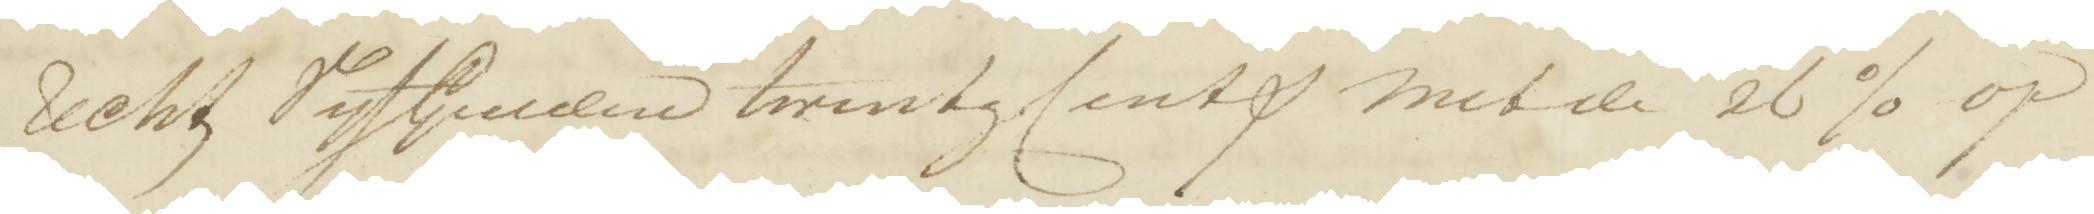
recht Vyf Gulden twintig Cents met de 26% op
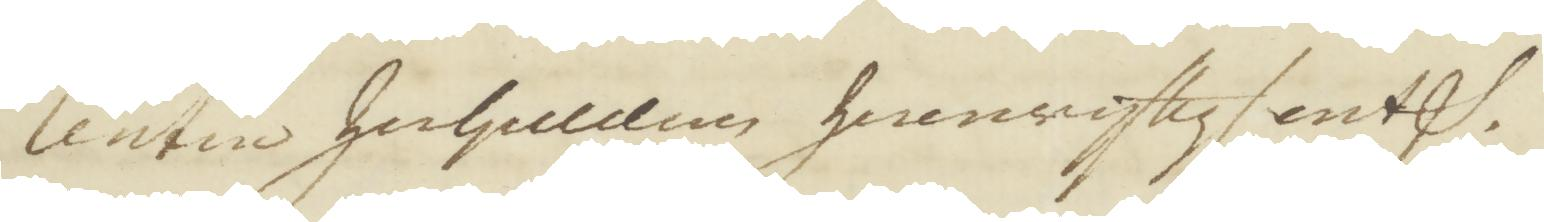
Centen Zes Guldens Zesenvijftig Cents.
